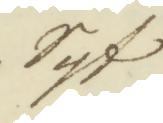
Vyf
